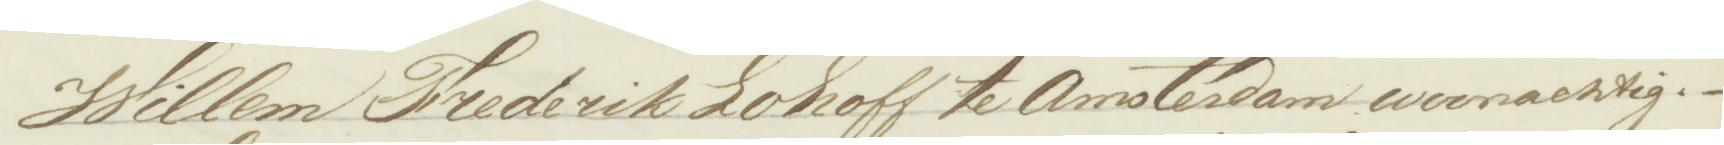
Willem Frederik Lohoff te Amsterdam woonachtig.
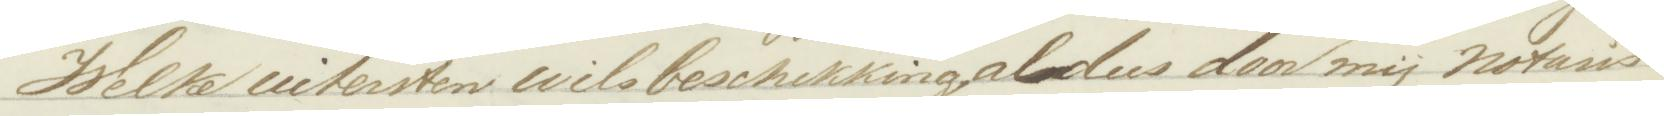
Welke uitersten wils beschikking aldus door mij notaris
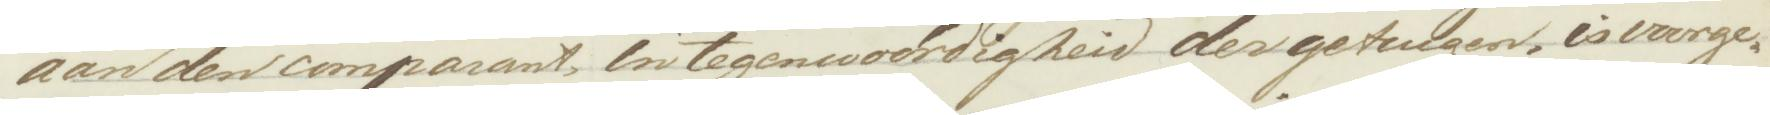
aan den comparant, in tegenwoordigheid der getuigen, is voorge„
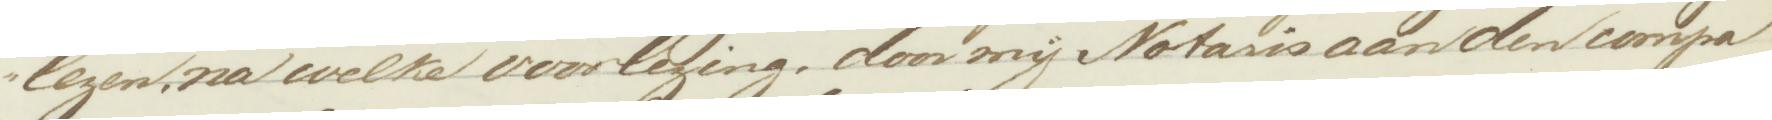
„lezen, na welke voorlezing, door mij Notaris aan den compa
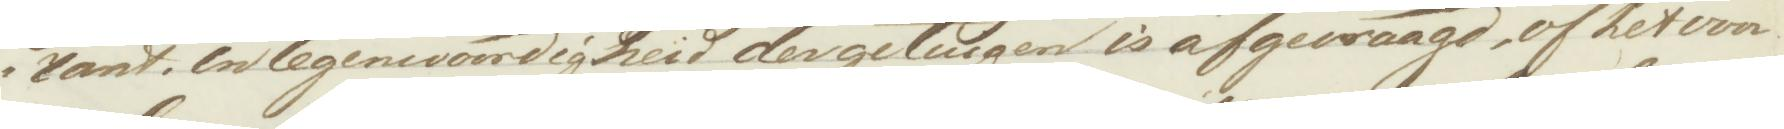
rant, in tegenwoordigheid der getuigen is afgevraagd, of het voor
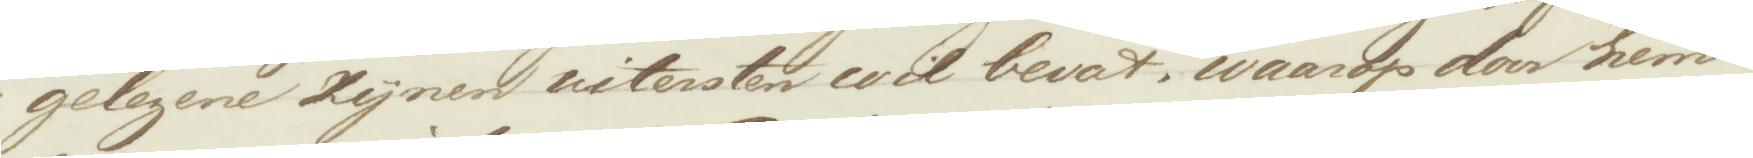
gelezene zijnen uitersten wil bevat, waarop door hem
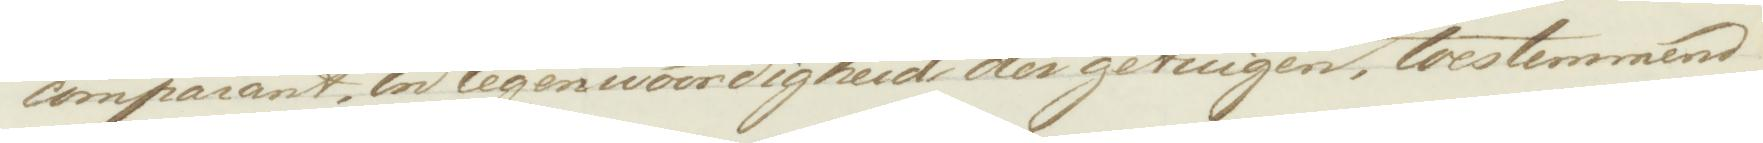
comparant, in tegenwoordigheid der getuigen, toestemmend
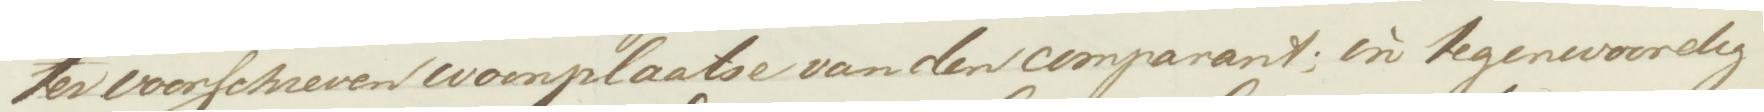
ter voorschreven woonplaatse van den comparant; in tegenwoordig
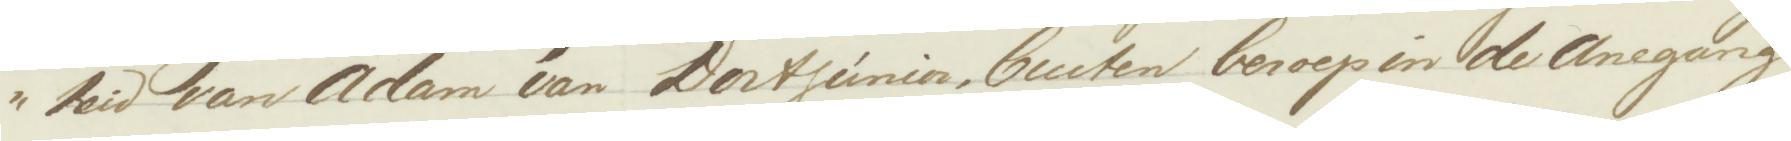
„heid van Adam van Dort junior, buiten beroep in de Anegang
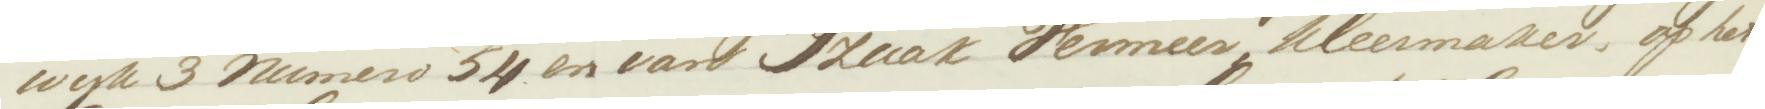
wyk 3 Numero 54 en van Izaak Vermeer kleermaker, op het
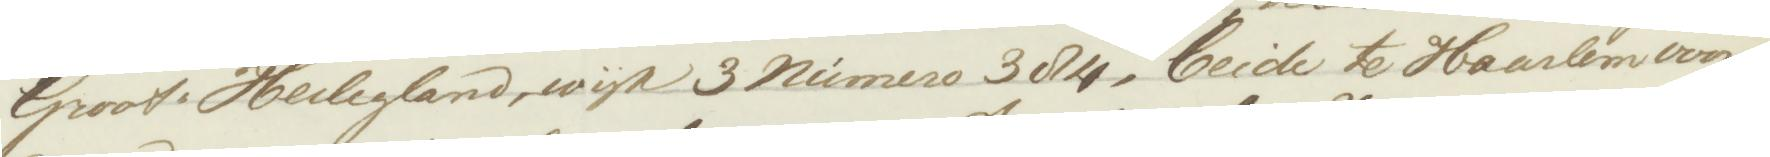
Groote Heiligland, wijk 3 Numero 384, beide te Haarlem voor
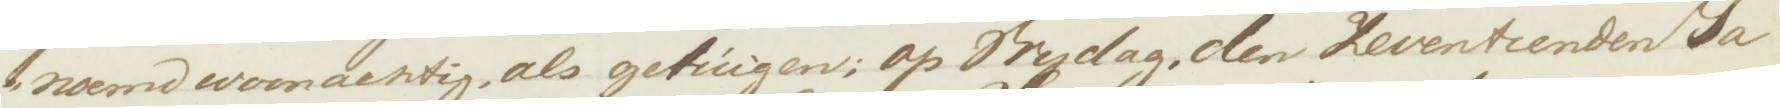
„noemd woonachtig, als getuigen; op Vrijdag, den zeventienden Ia
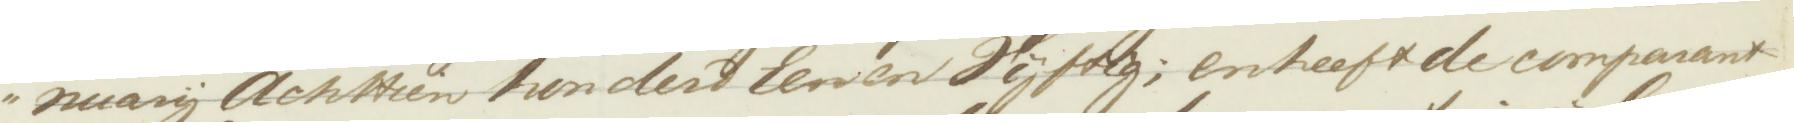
„nuarij Achttien honderd Een en Vijftig; en heeft de comparant
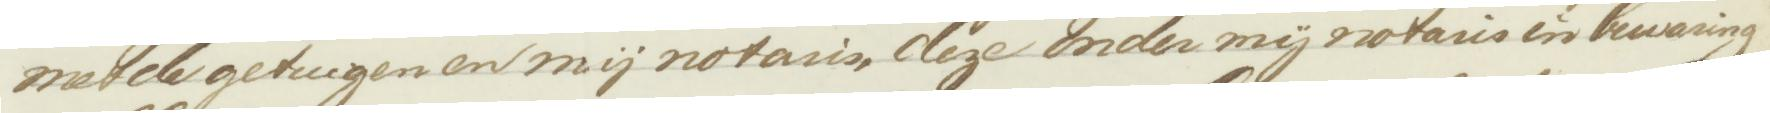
met de getuigen en mij notaris, deze onder mij notaris in bewaring
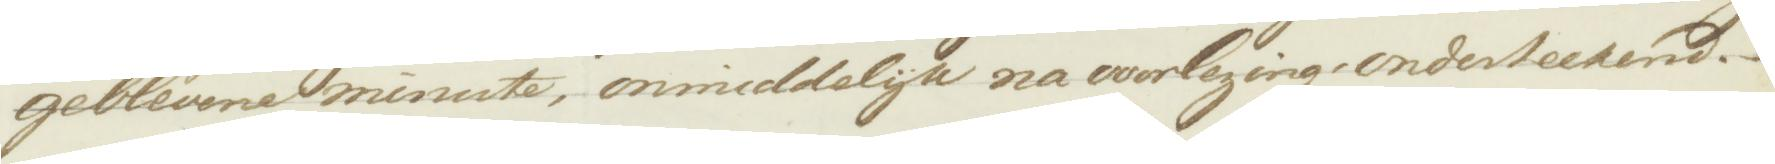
geblevene minute, onmiddelijk na voorlezing, onderteekend.
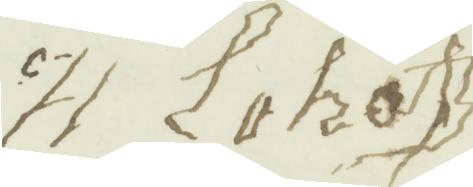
H Lohof
